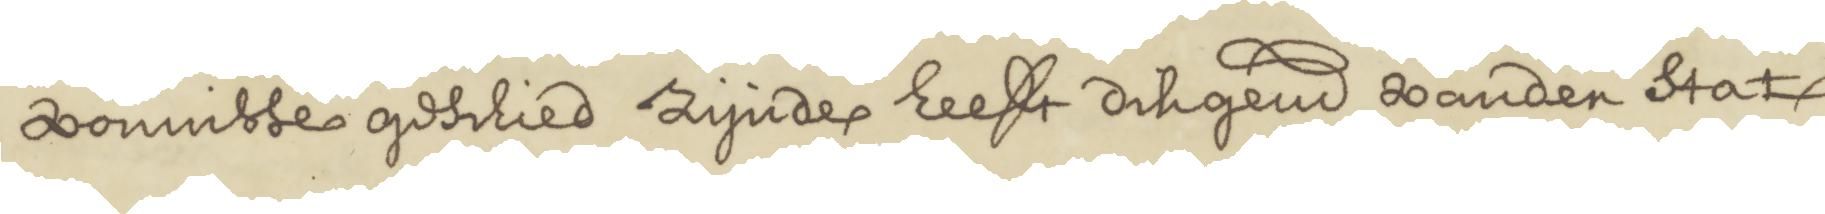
vonnisse geschied zijnde heeft dikgem vander stat
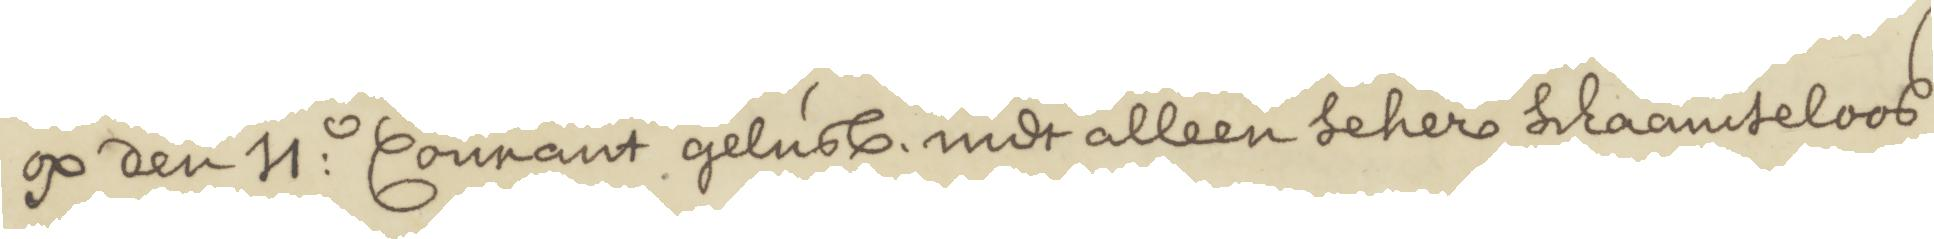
op den 11:' Courant gelust, niet alleen seker schaamteloos
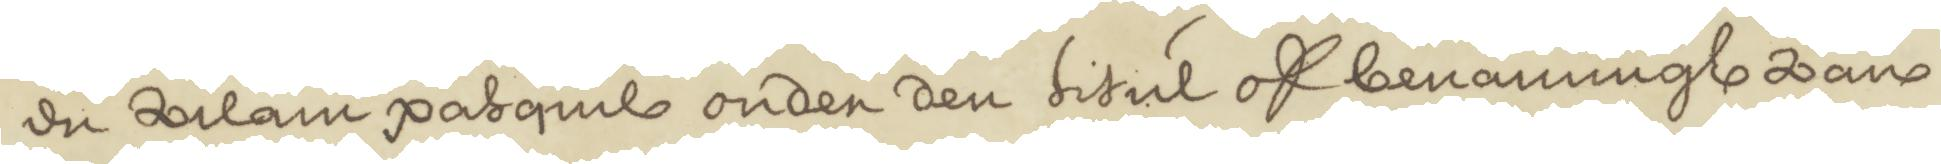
en vilain pasquil onder den titul of benamingh van
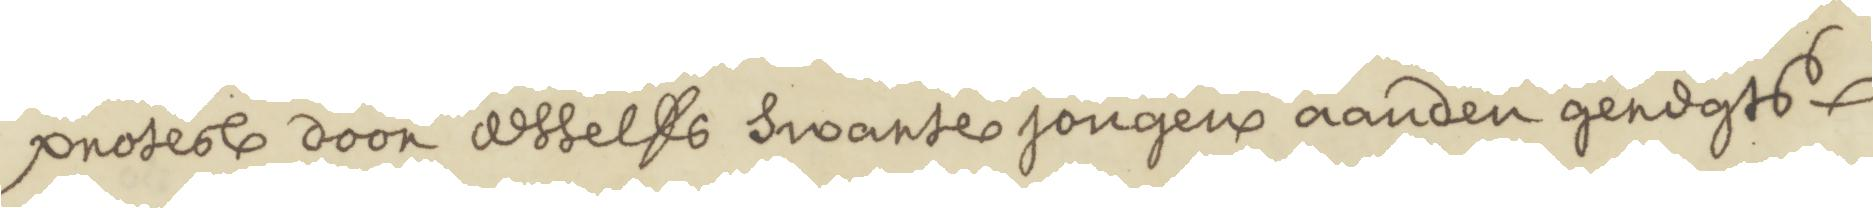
protest door desselfs swarte jongen aanden geregts—
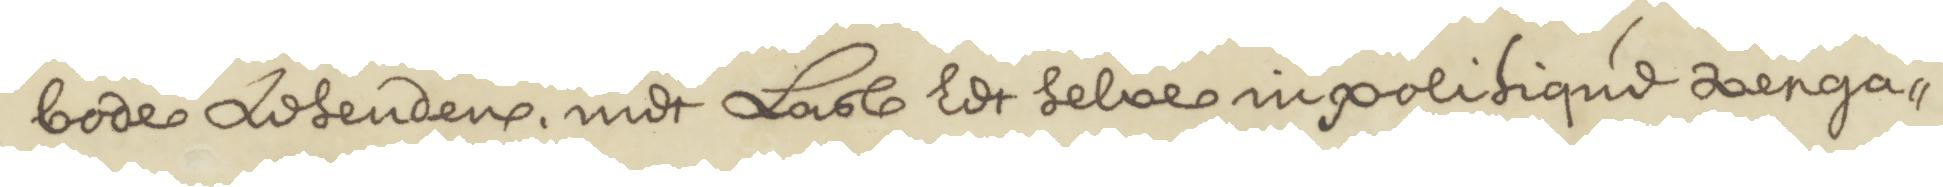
bode tesenden, met Last het selve in politique verga„
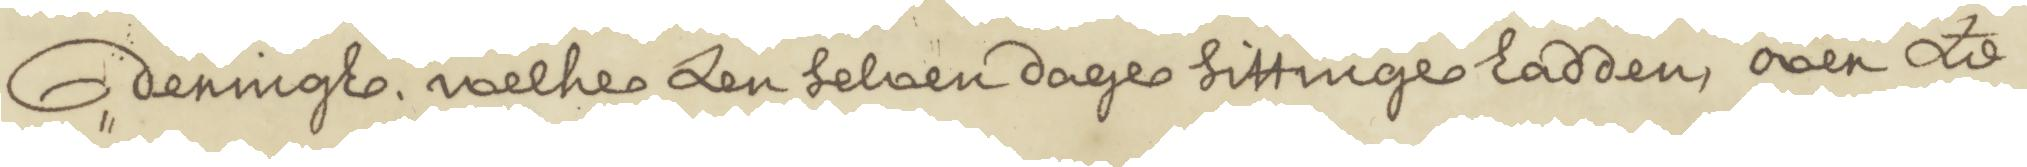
„deringh, welke ten selven dage sittinge hadden, over te
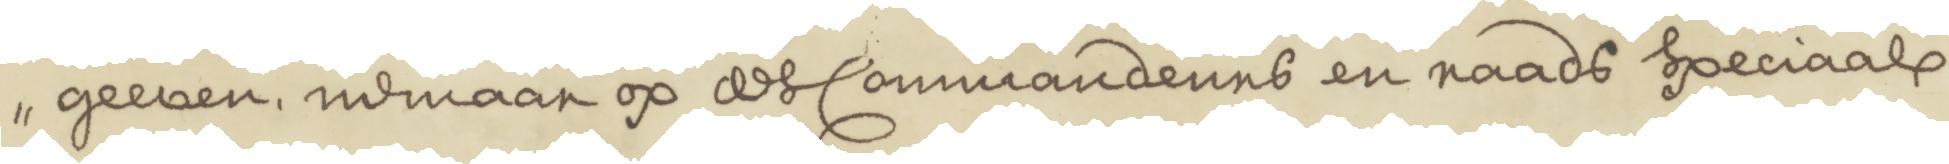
„geeven, nemaar op des Commandeurs en raads speciaal
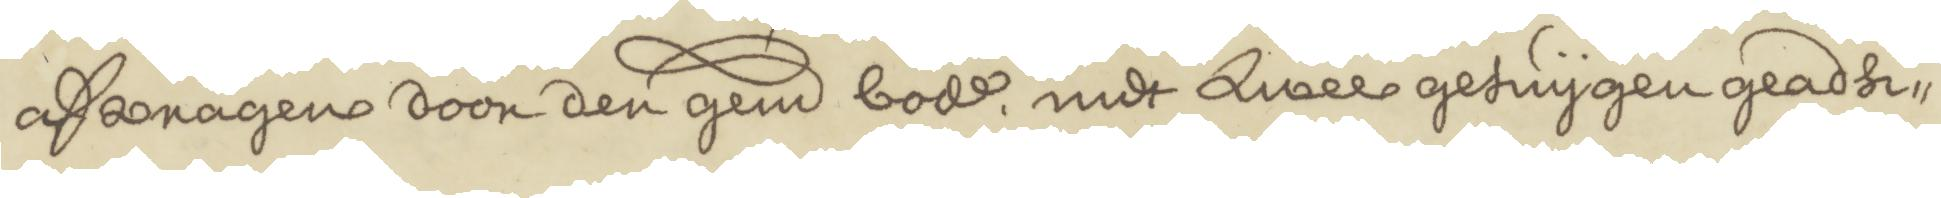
afvragen door den gem bode, met twee getuijgen geadsi„
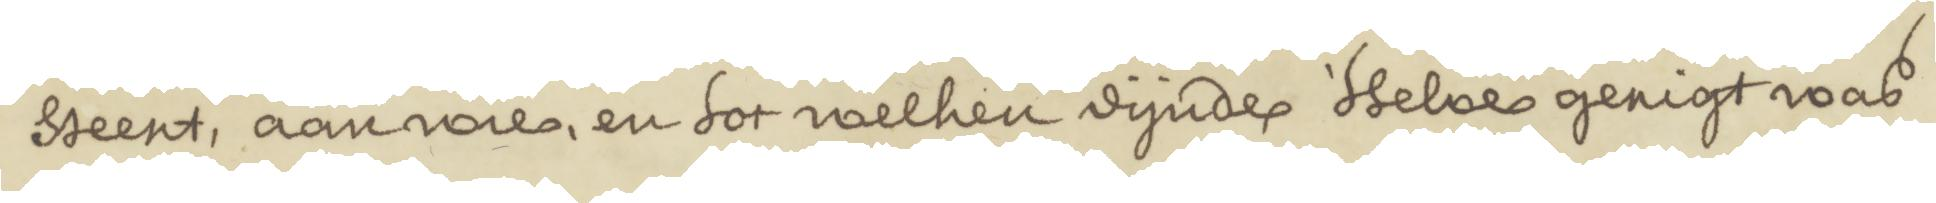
steert, aan wie, en tot welken eijnde 'tselve gerigt was
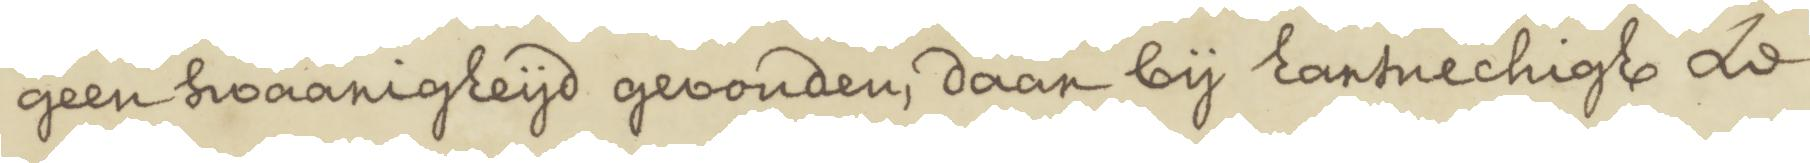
geen swaarigheijd gevonden, daar bij hartneckigh te
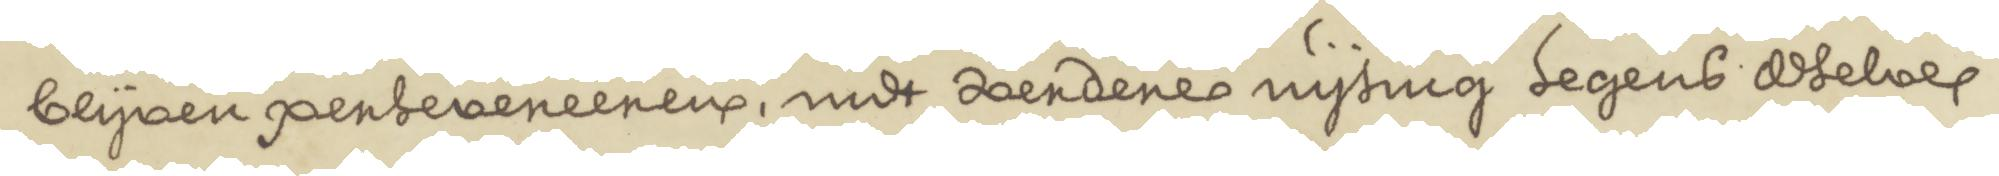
blijven persevereeren, met verdere uijting tegens deselve
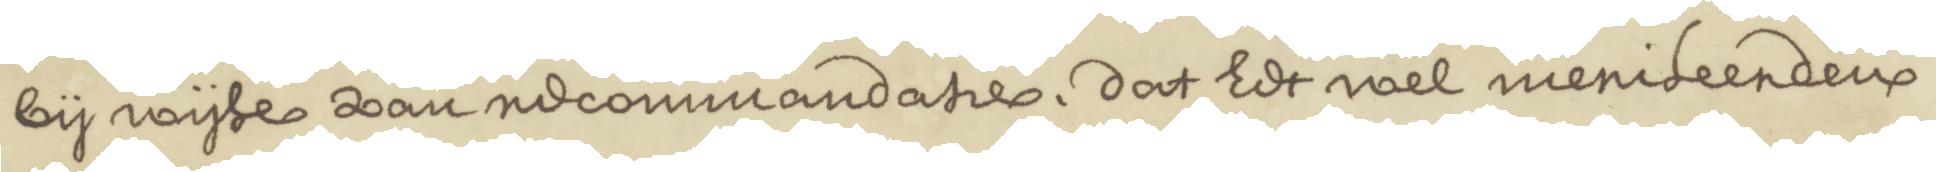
bij wijse van recommandatie, dat het wel meriteerden
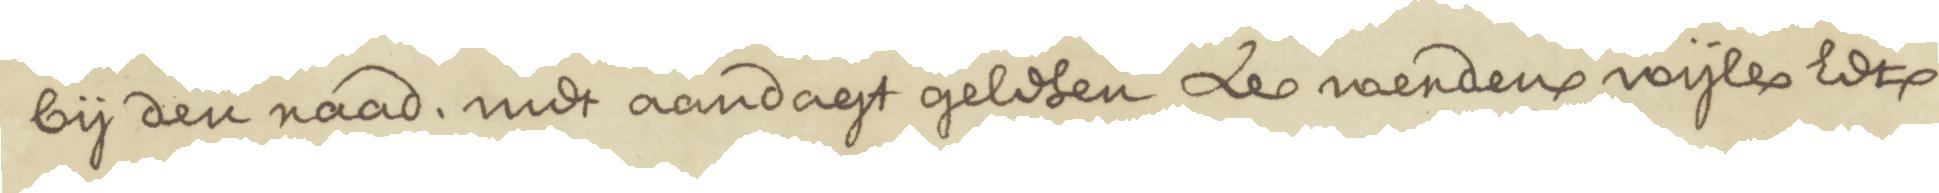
bij den raad, met aandagt gelesen te werden wijle het
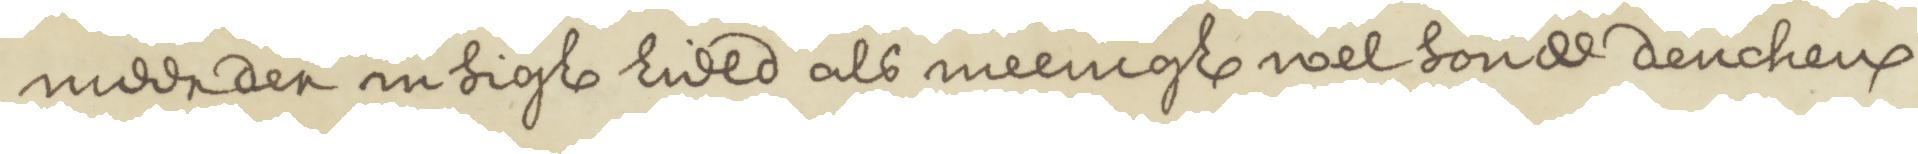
meerder in sigh hield als meenigh wel soude dencken
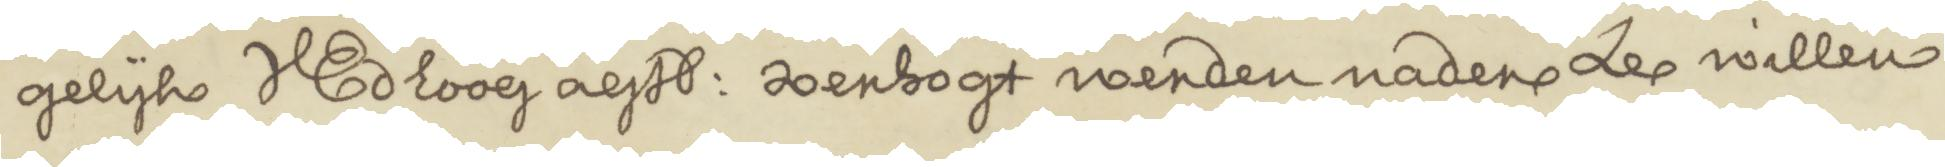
gelijk VEd hoog agtb: versogt werden nader te willen
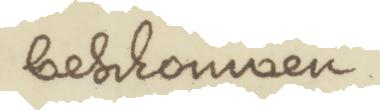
beschouwen
